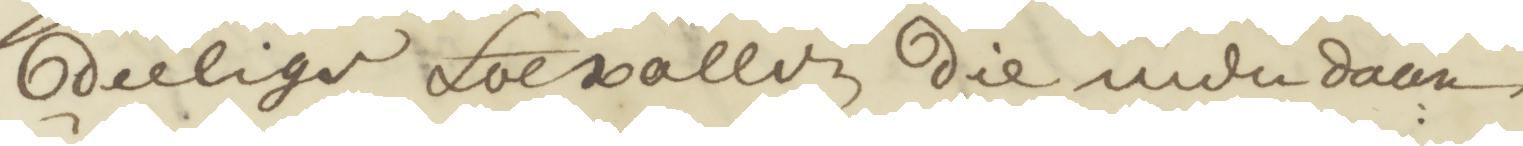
deelige toevallen die men daar
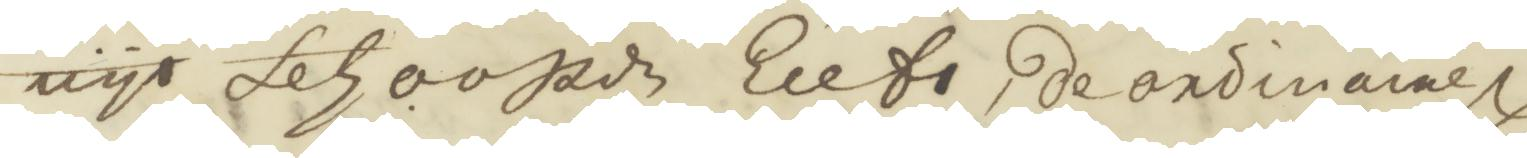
uijt tehoopen heeft, de ordinaire
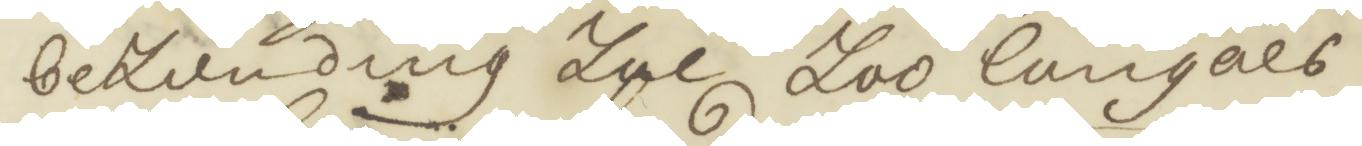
bezending zal zoo lang als
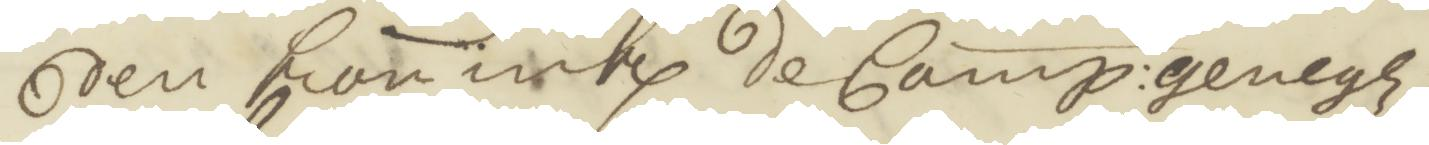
den konink de Comp: genegen
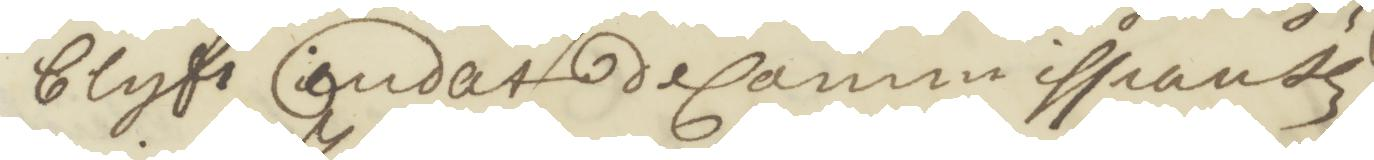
blijft indat de Commissianten
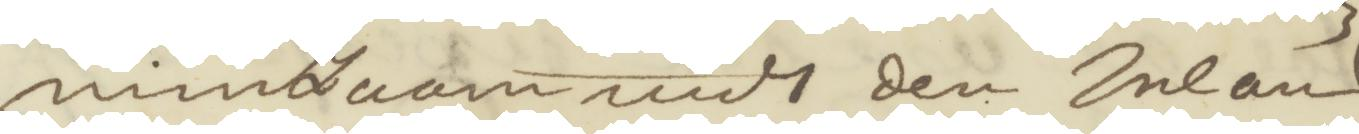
minzaam met den Inlan
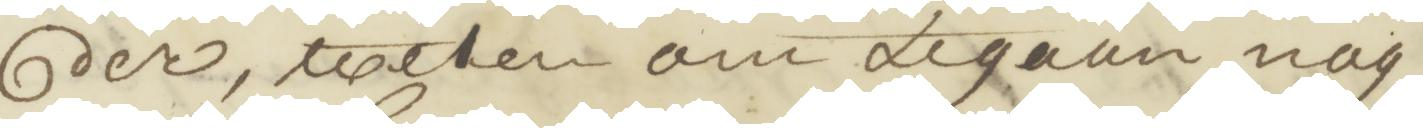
der, weten om tegaan nog
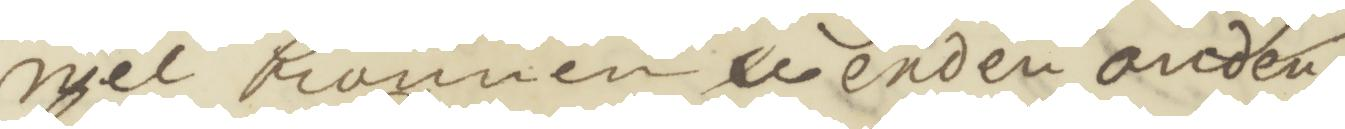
wel konnen werden onder
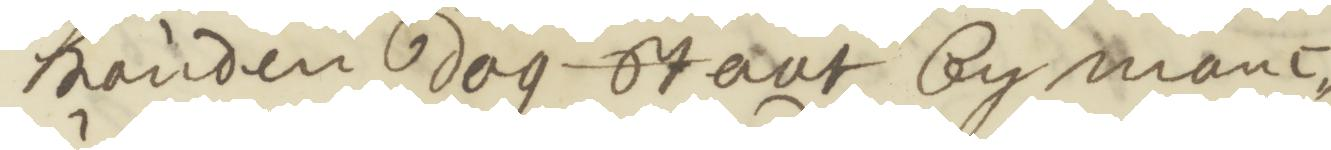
houden dog staat bij manc„
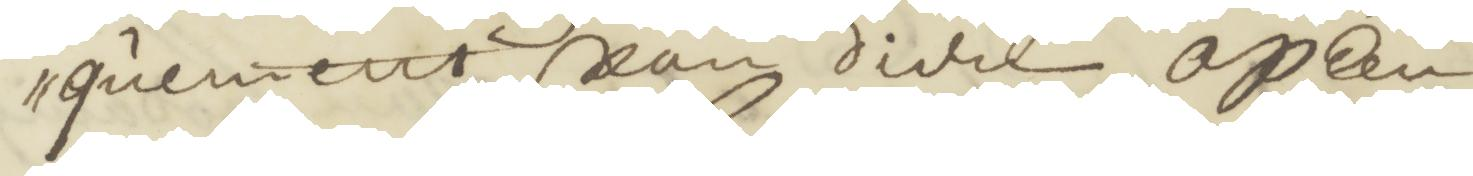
„quement van dien op Een
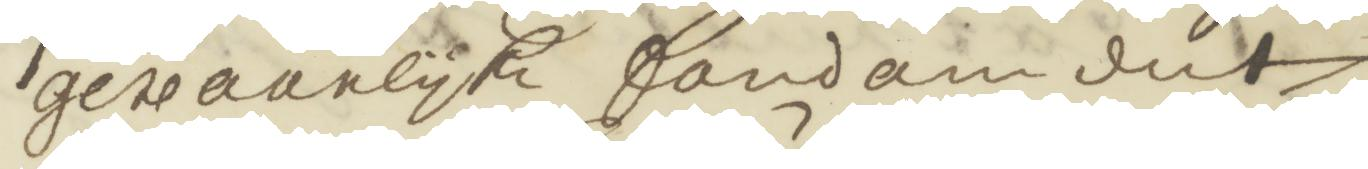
gevaarlijk fondament,
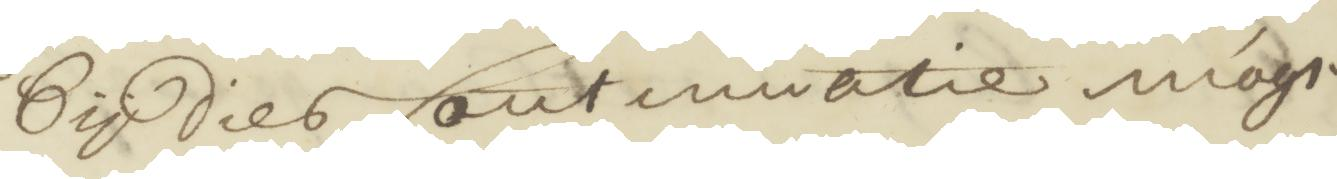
bij dies Continuatie mogt
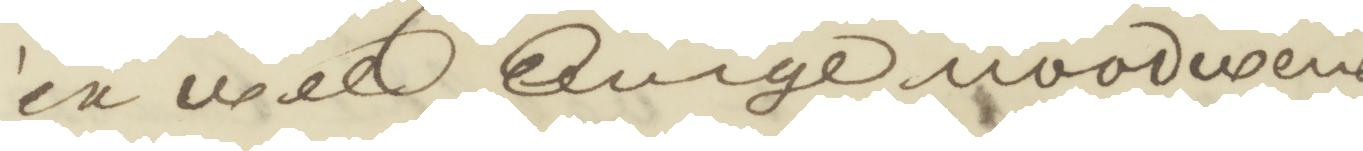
'er wel Eenige noodwen
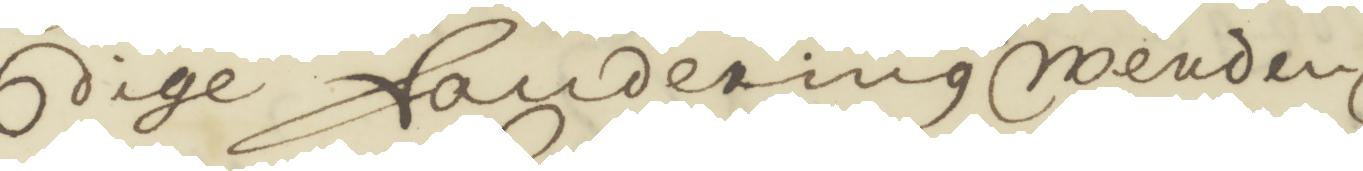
dige verandering werden
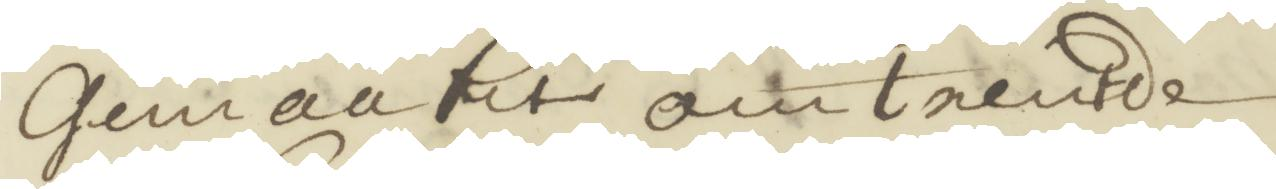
gemaakt omtrent de
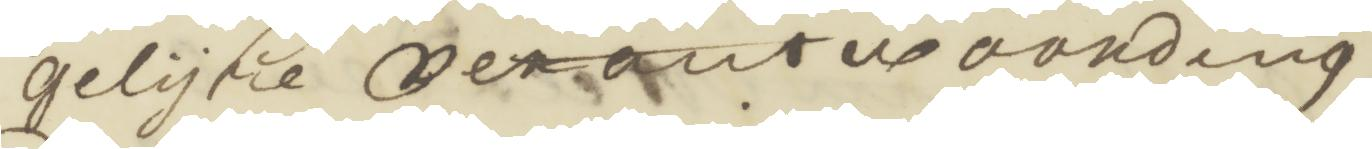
gelijke verantwoording
